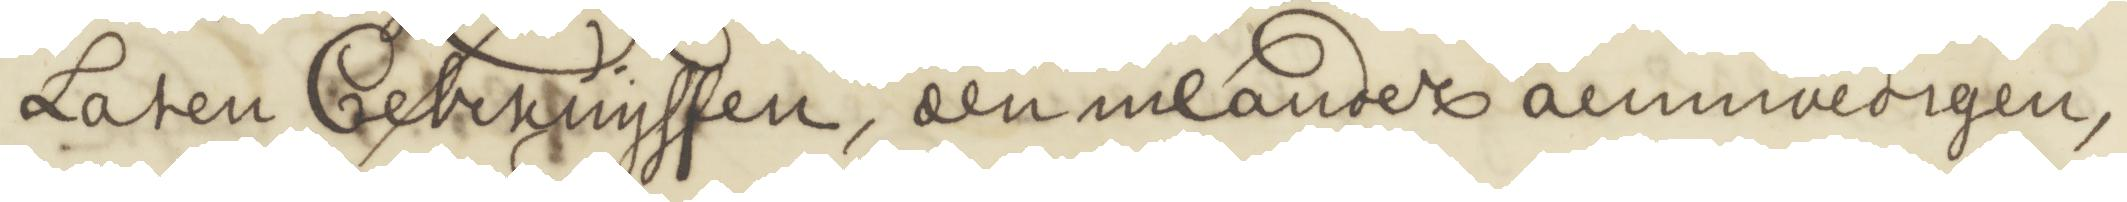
laten bekruijssen, den inlander aenmoedigen,
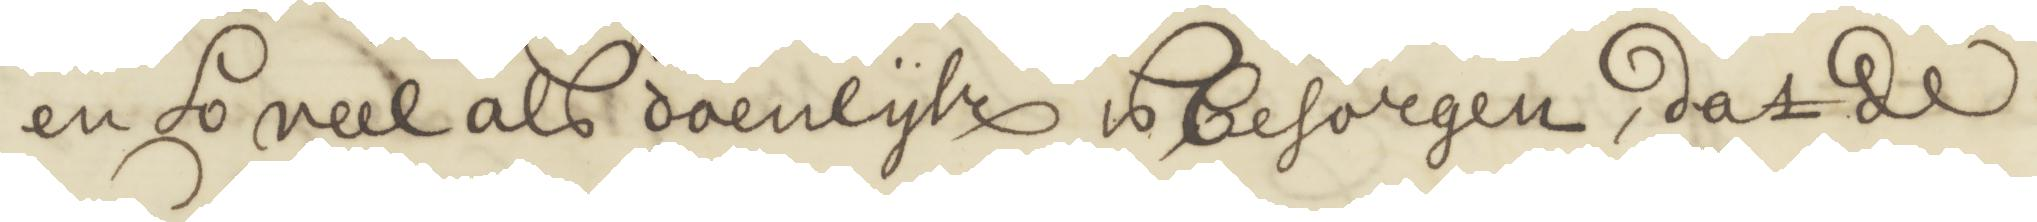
en so veel als doenlijk is besorgen, dat de
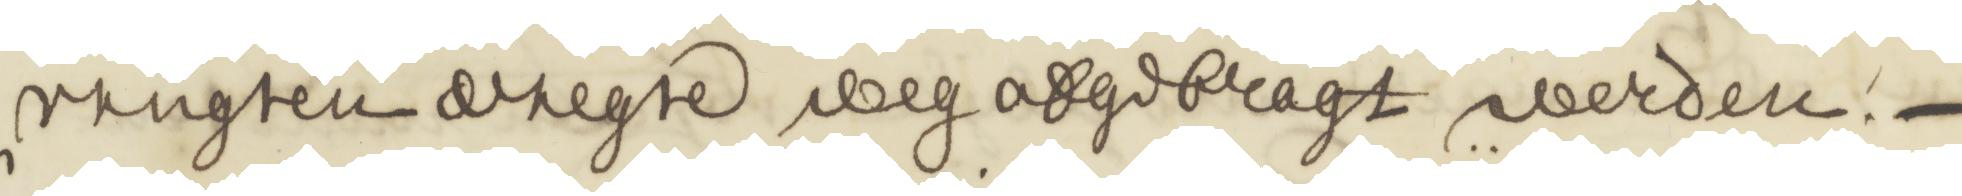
vrugten de regte weg afgebragt werden. —
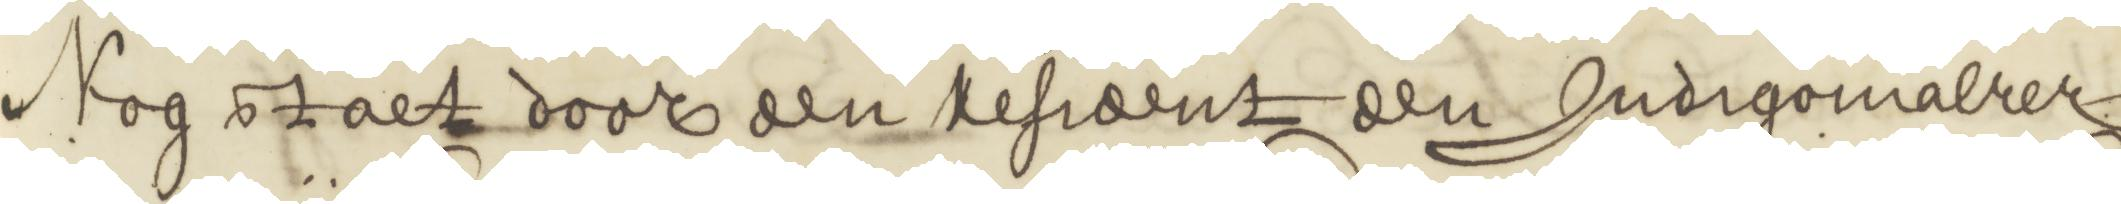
Nog staet door den resident den Jndigomaker
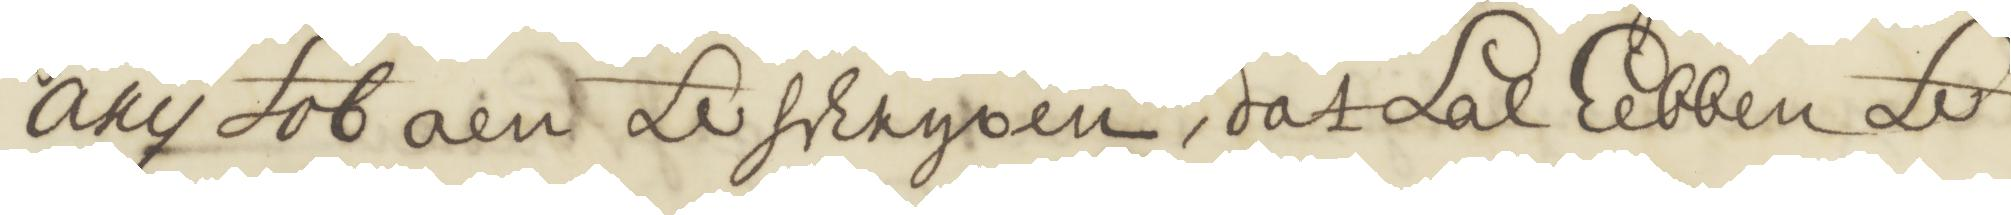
arij tob aen te schrijven, dat sal hebben te
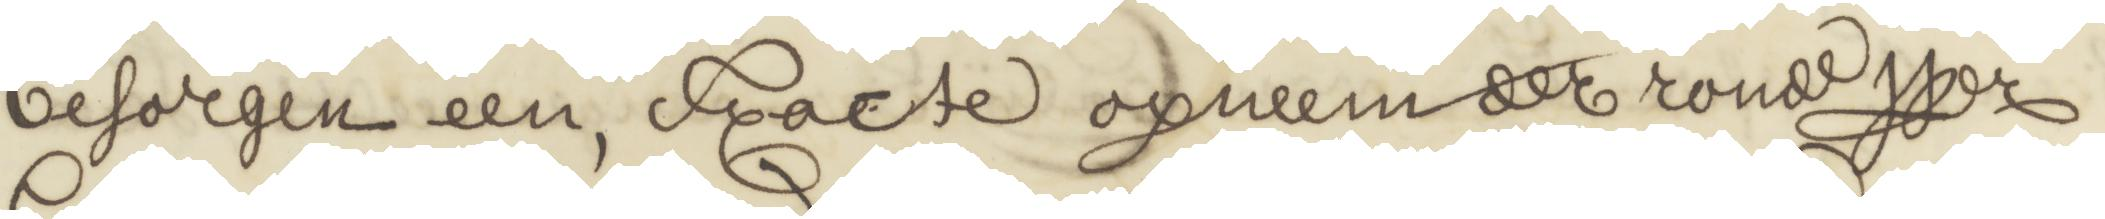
besorgen een, Exacte opneem der ronde pper
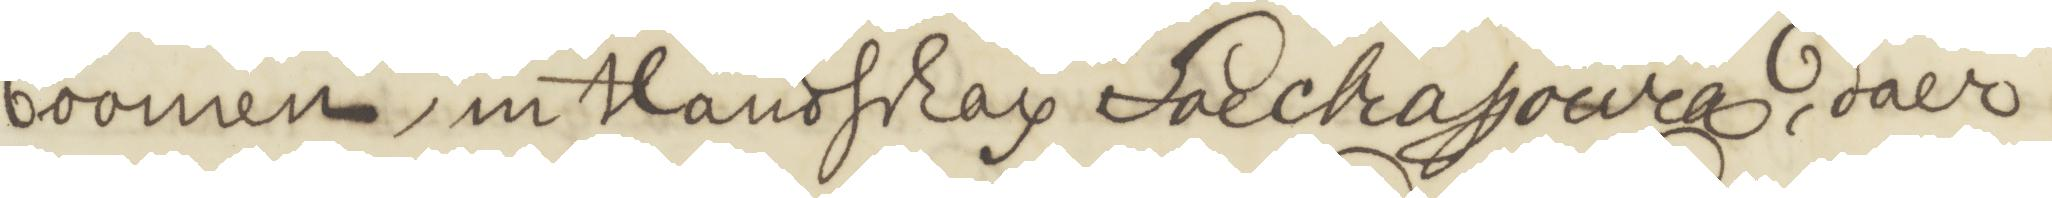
boomen, in 'tlandschap soeckapoura, daer
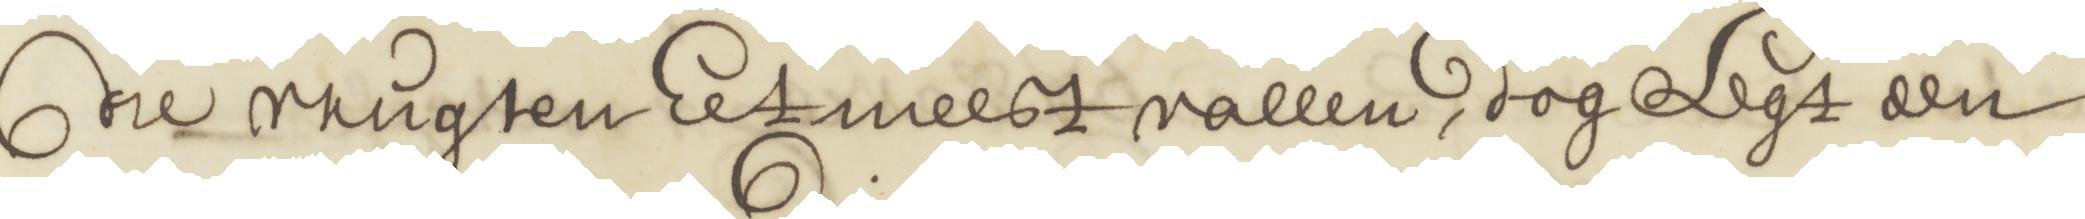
die vrugten het meest vallen, dog segt den
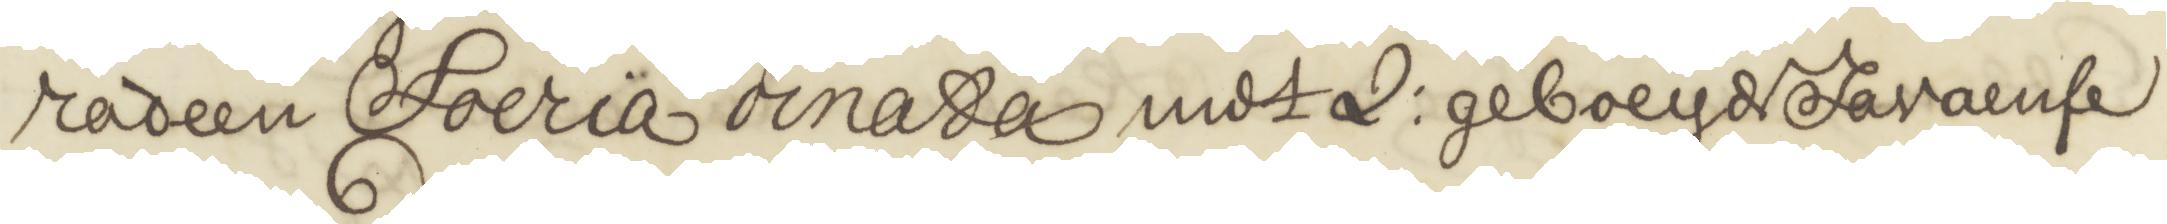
radeen soeria dinata met 2: geboeijde Iavaense
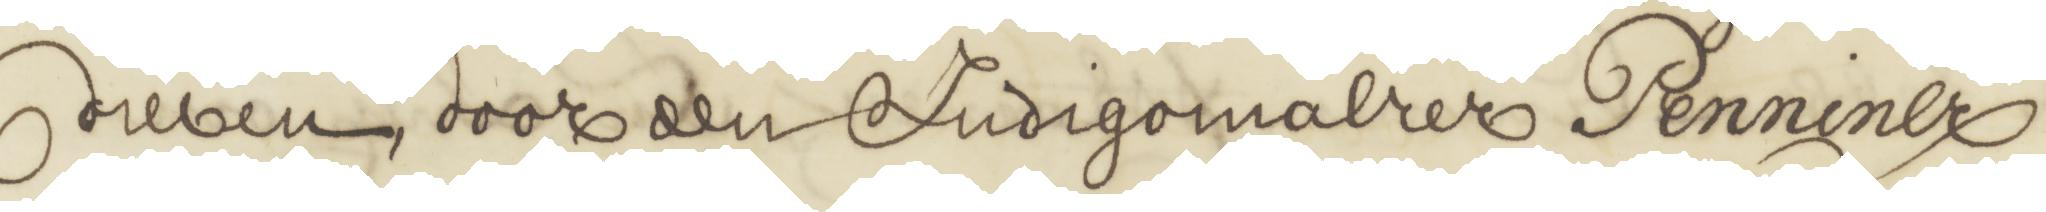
dieven, door den Indigomaker Pennincx
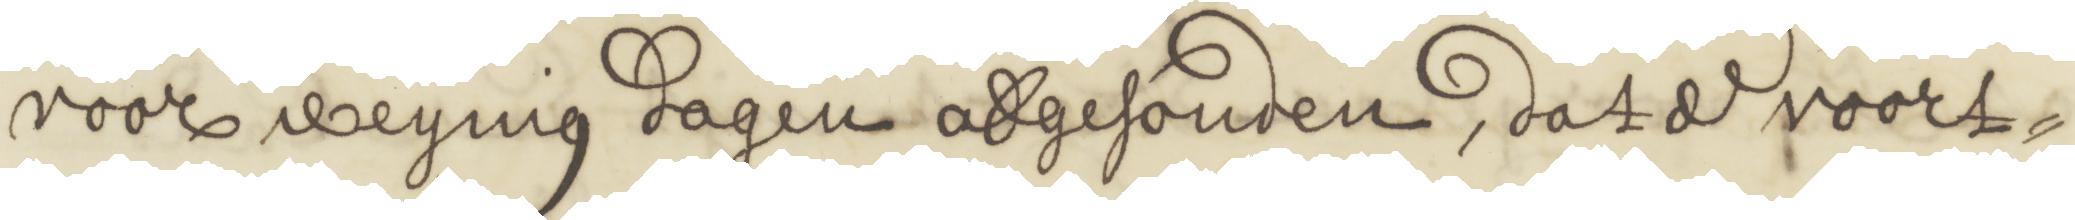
voor weijnig dagen afgesonden, dat de voort„
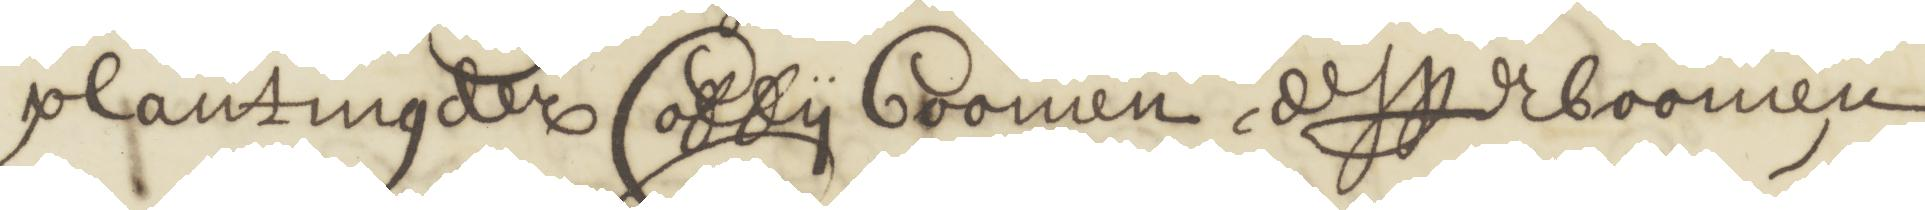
planting der Coffij boomen de pper boomen
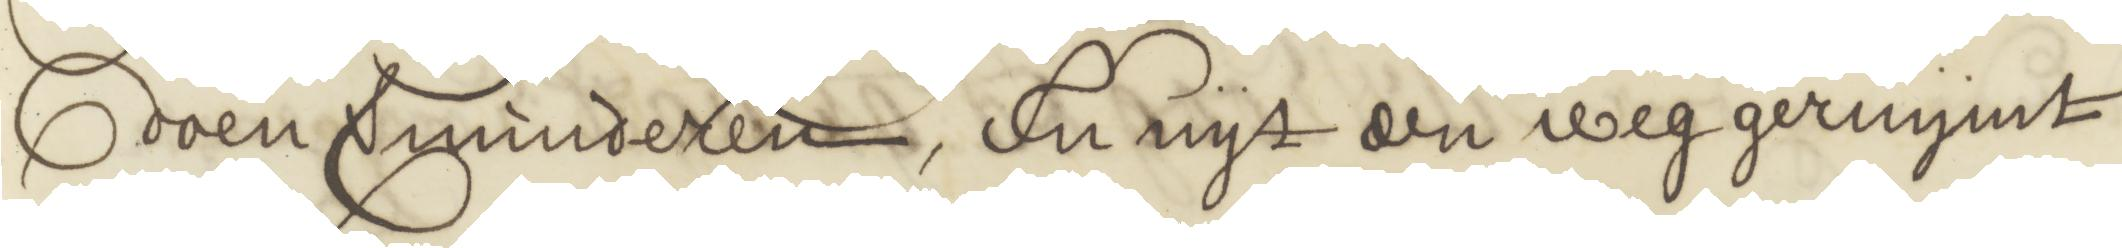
doen verminderen, En uijt den weg geruijmt
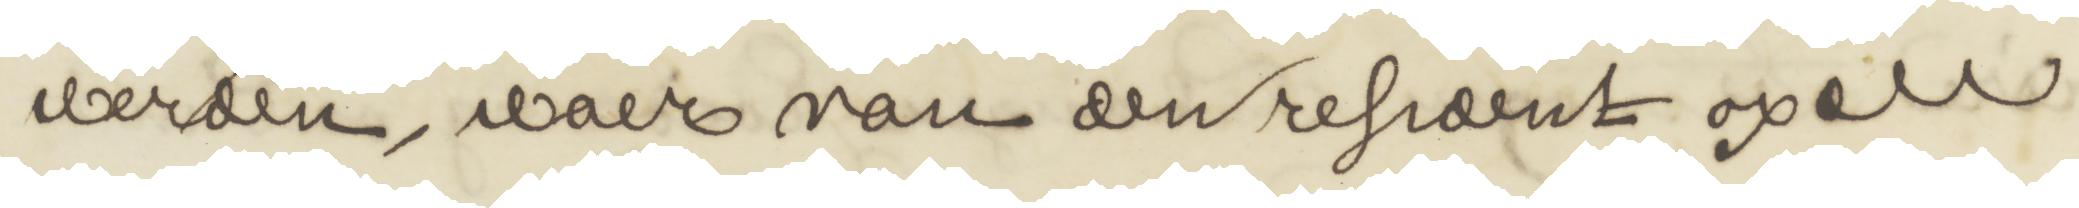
werden, waer van den resident op en
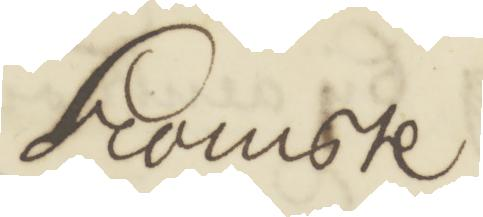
komste
